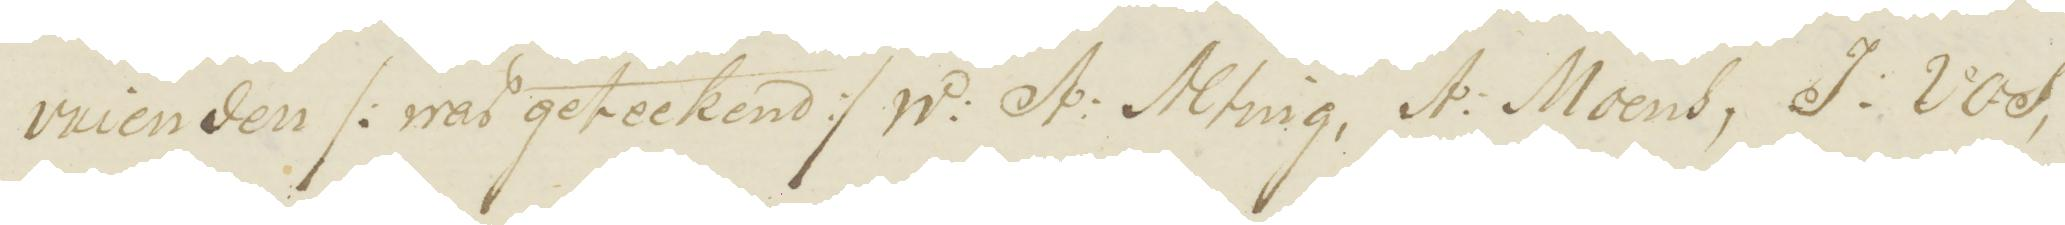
vrienden /:was geteekend:/ W: A: Alting, A: Moens, J: Vos,
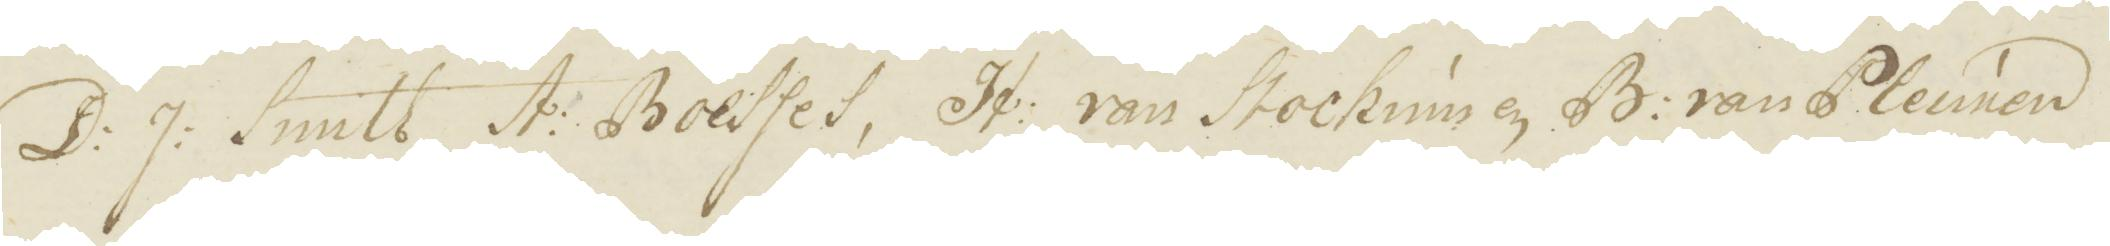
D: J: Smitt, A: B2oesses, H: van Stockum en B: van Pleuren
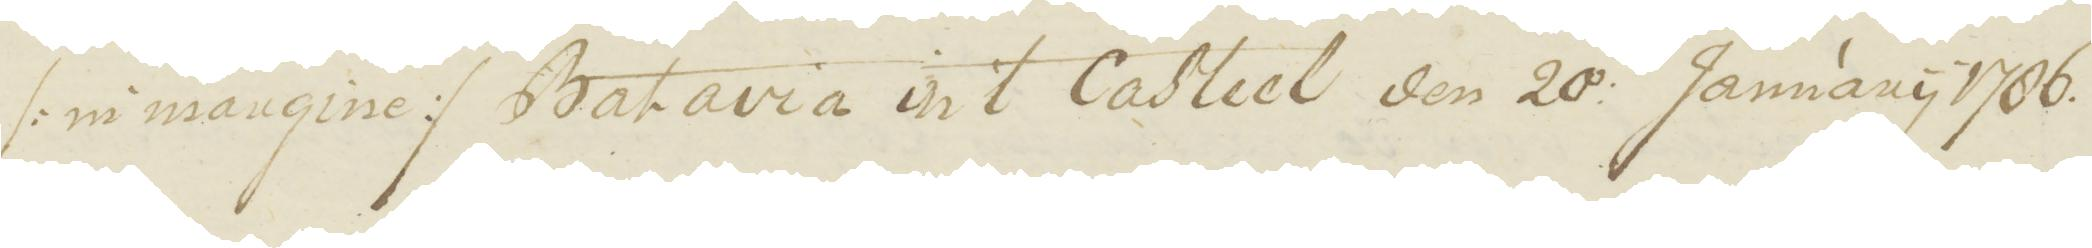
/:in margine:/ Batavia in ’t Casteel den 20: Januarij 1786.
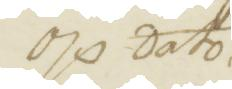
op dato
